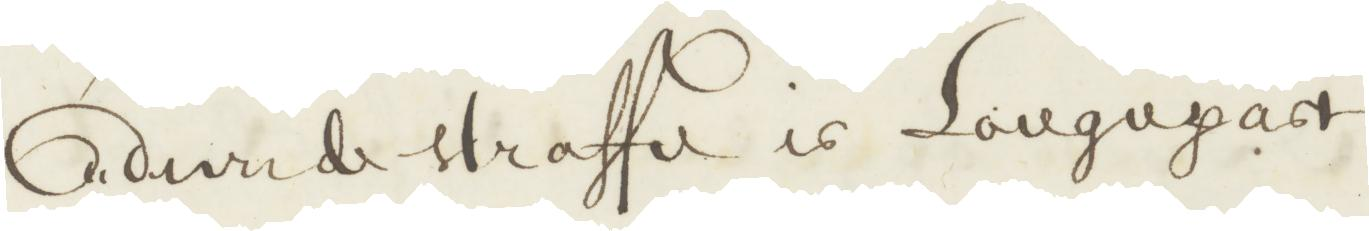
diende straffe is toegepast
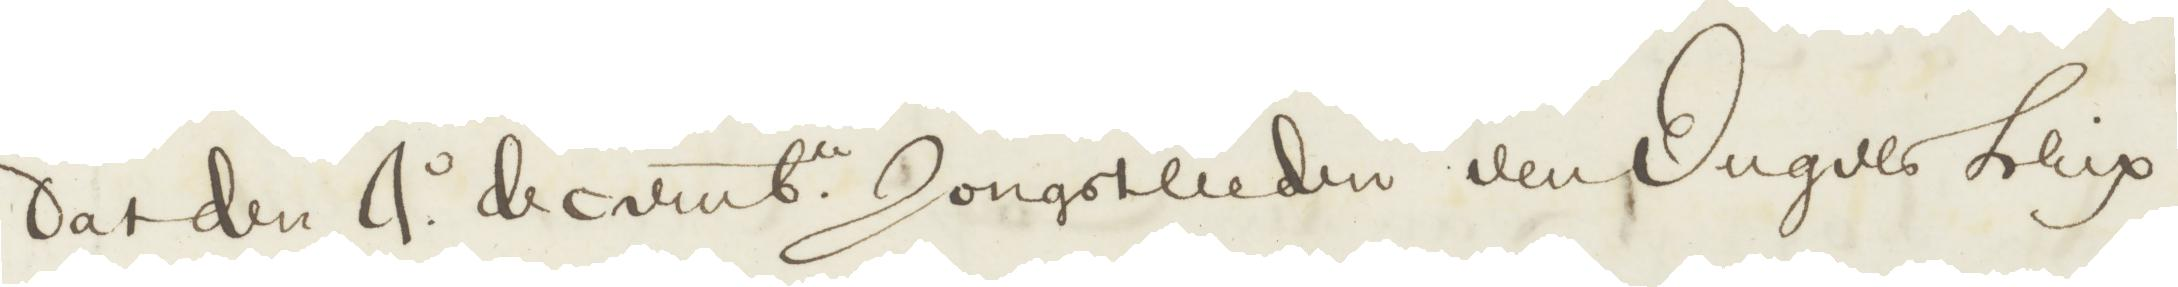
dat den 4.' decemb.re jongstleeden een Engels schip
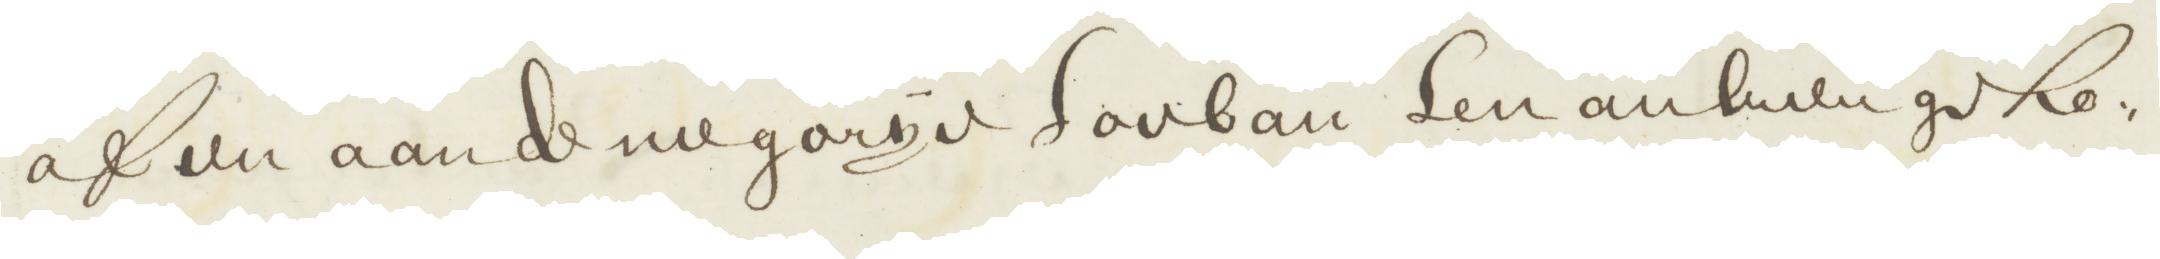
af en aan de negorije toeban ten anker geko„
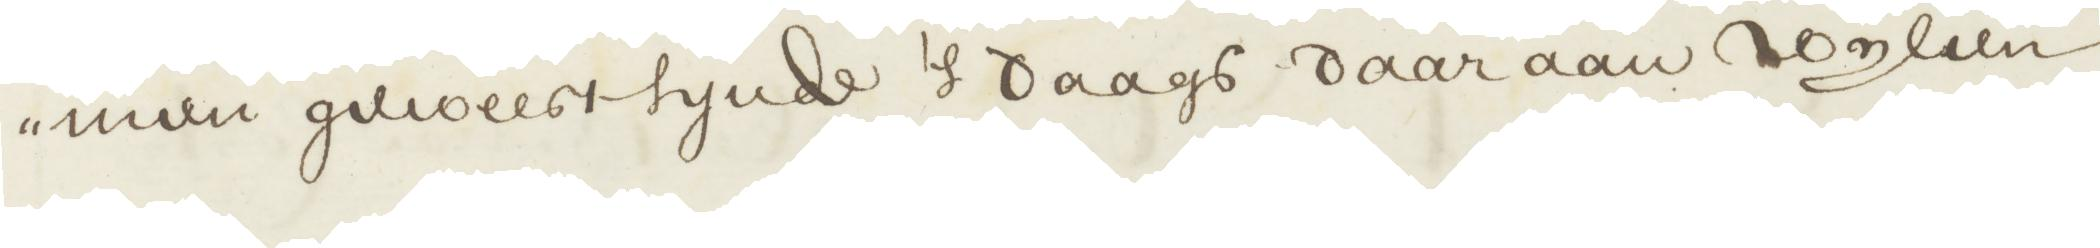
„men geweest sijnde 's daags daar aan wijlen
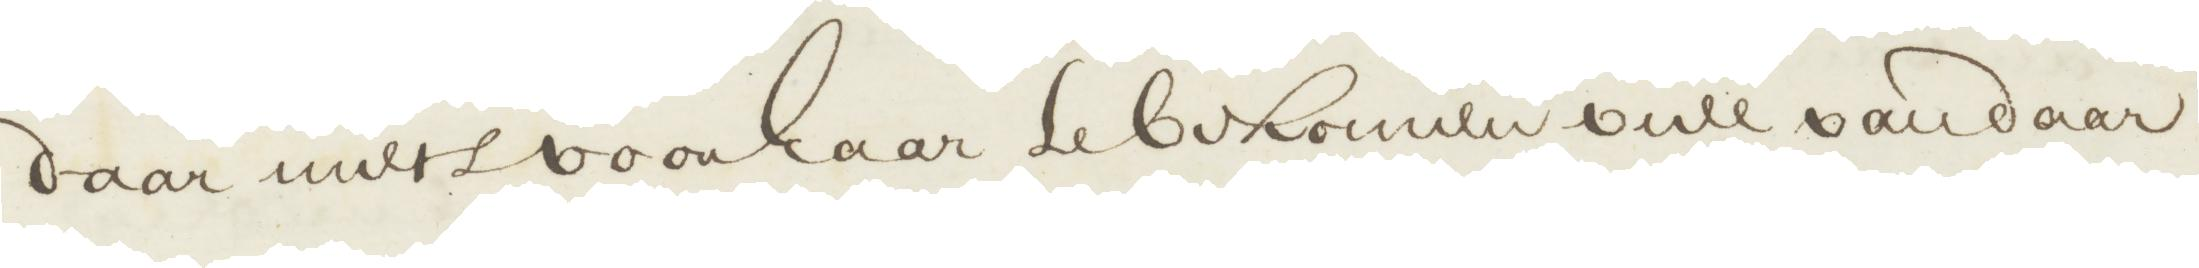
daar niets voor haar te bekomen viel van daar
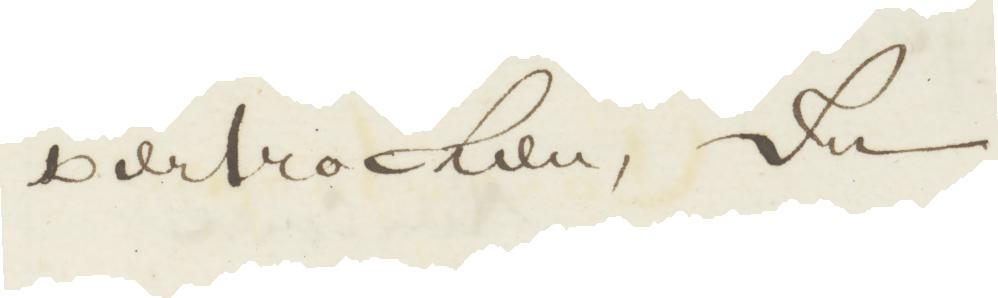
vertrocken, En,
